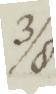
3/8
